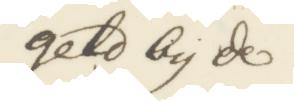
geld bij de
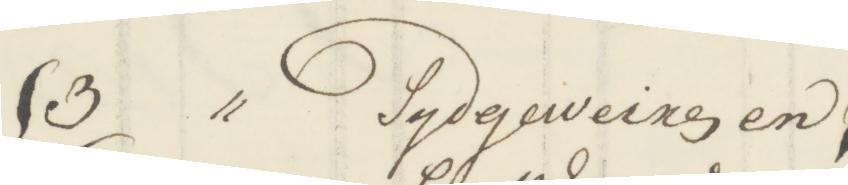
3 „ sydgeweiren en
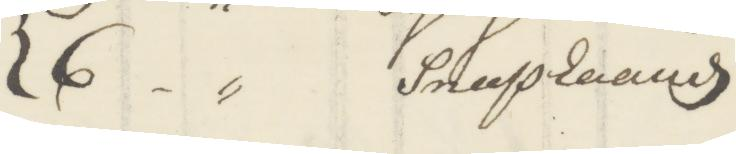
6 – „ snaphaanen
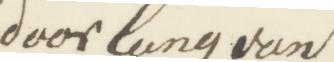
door lang van
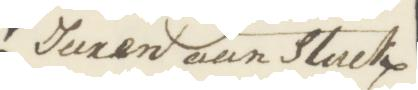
Iaren aan stuck
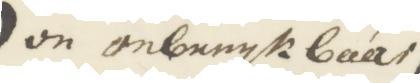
en onbruyk baar
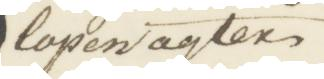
lopen agter
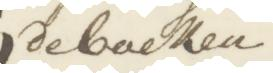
de boeken
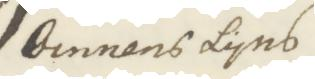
binnens sijns
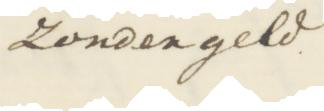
zonder geld
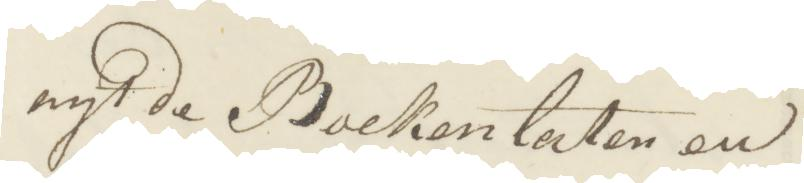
uijt de Boeken laten en
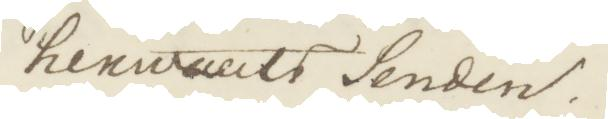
herwaats senden.
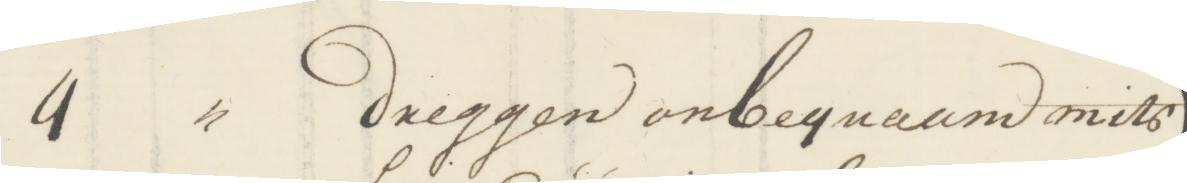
4 „ dreggen onbequaam mits
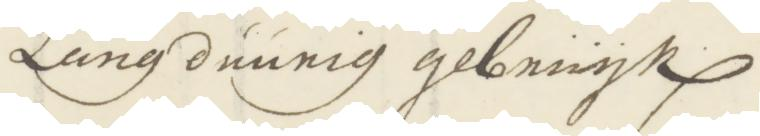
Lang duurig gebruijk
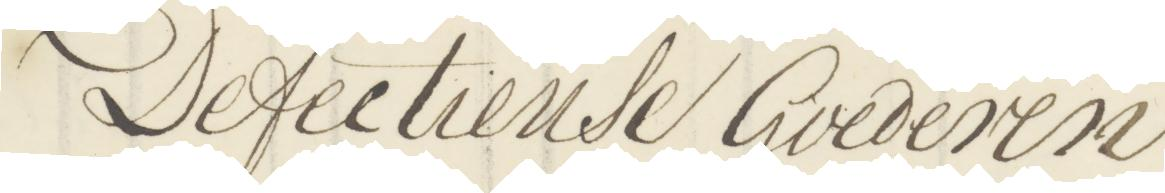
Defectieuse Goederen
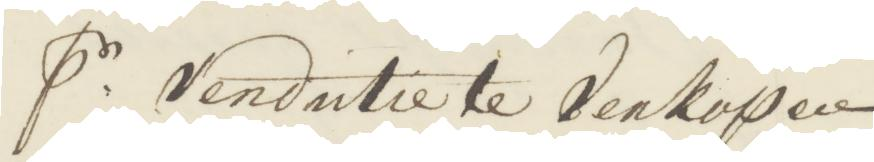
p:r vendutie te verkopen
